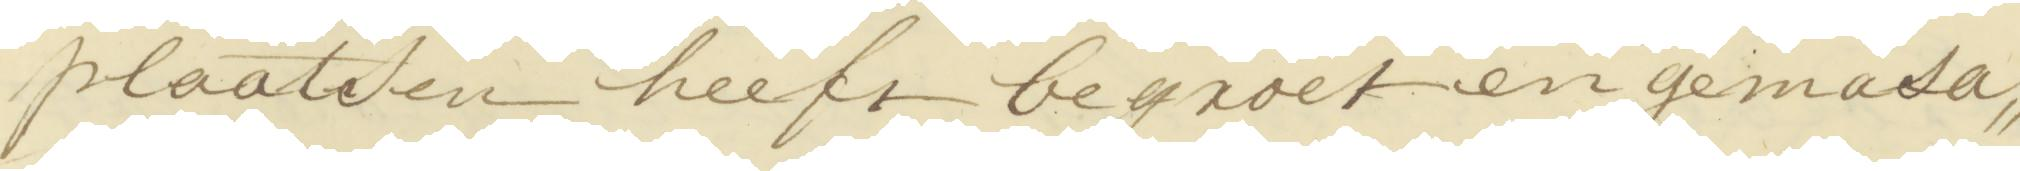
plaatsen heeft begroet en gemasa„
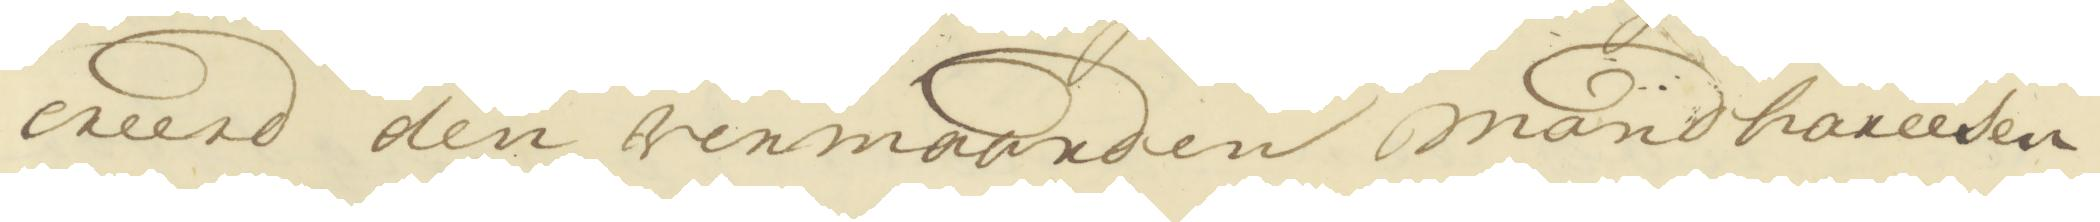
creerd den vermaarden mandhareesen
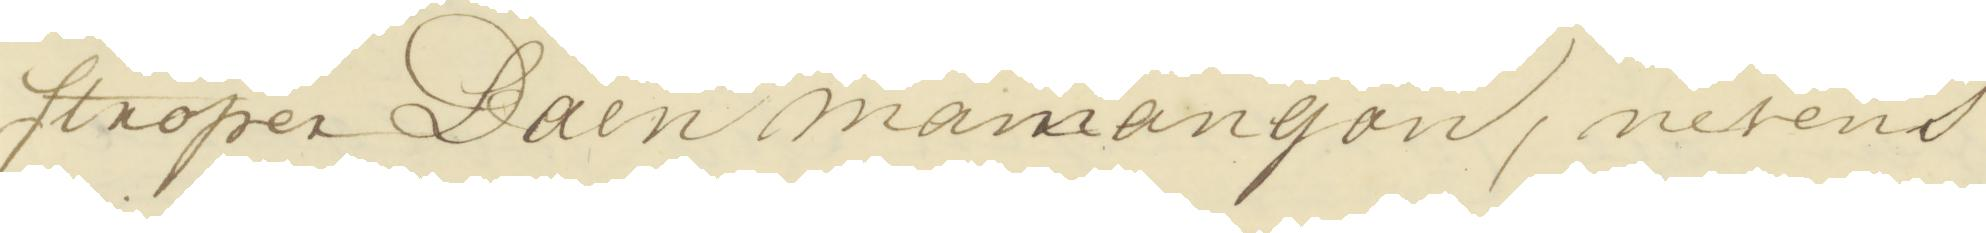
stroper Daen mamangon, nevens
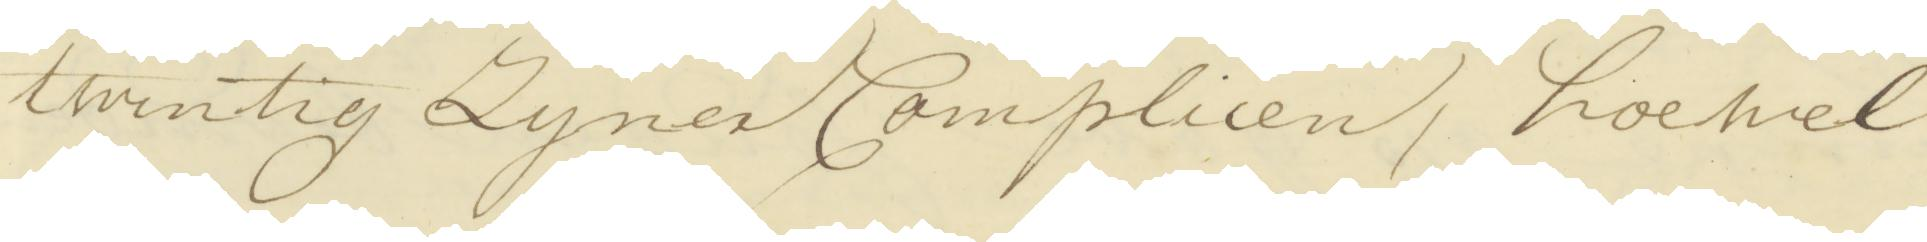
twintig Zyner Complicen, hoewel
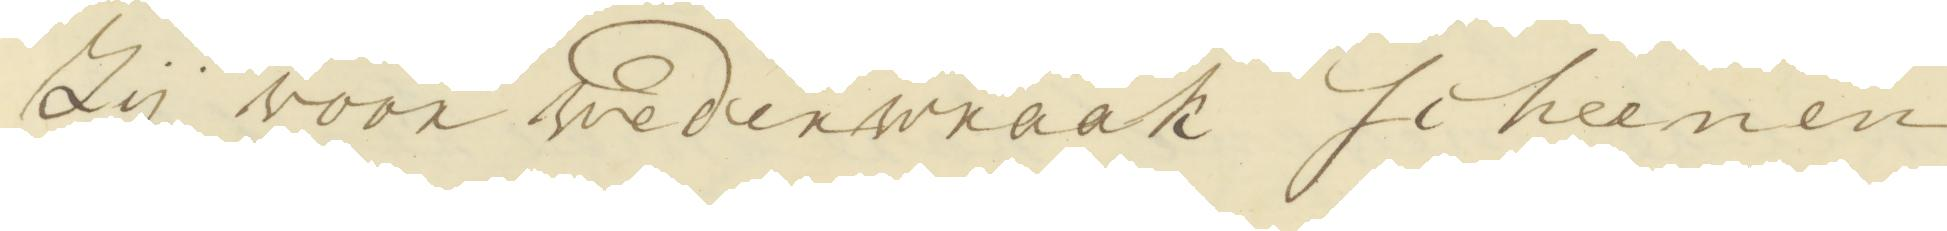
Zij voor wederwraak scheenen
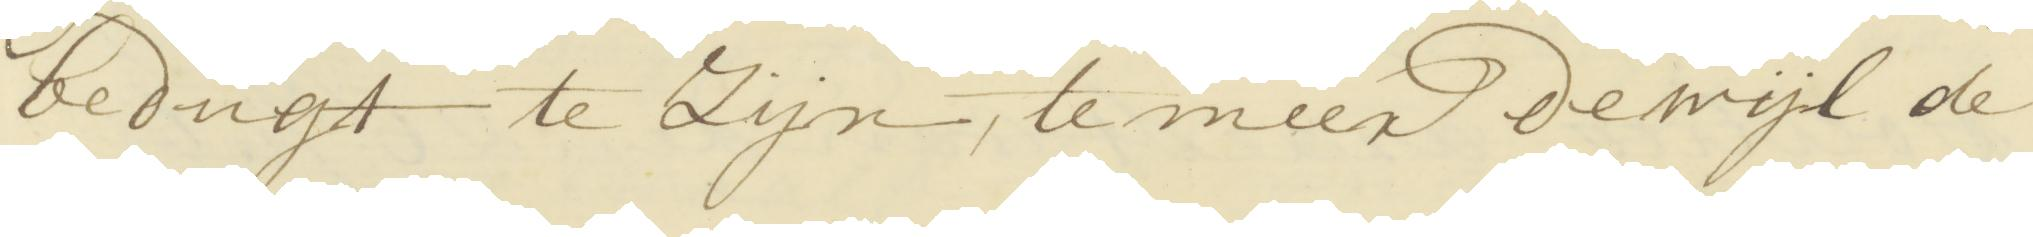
bedugt te Zijn, te meer dewijl de
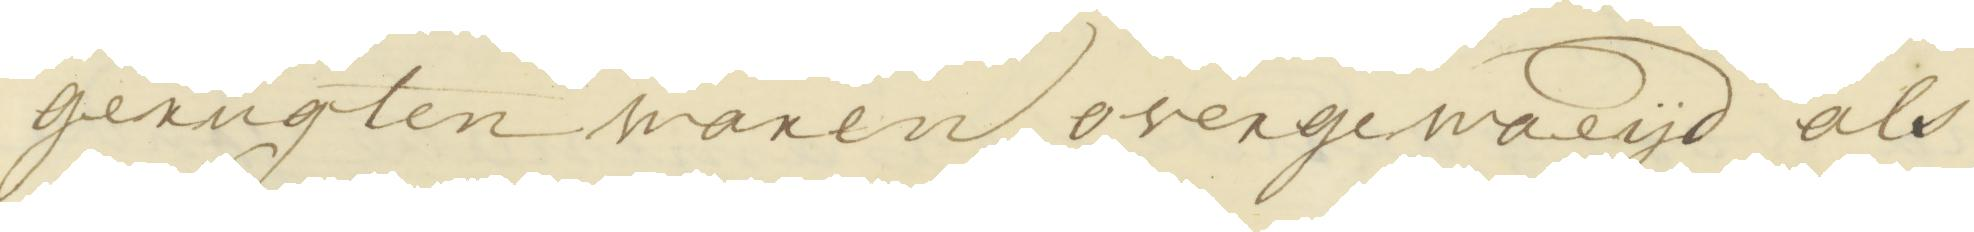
gerugten waren overgewaeijd als
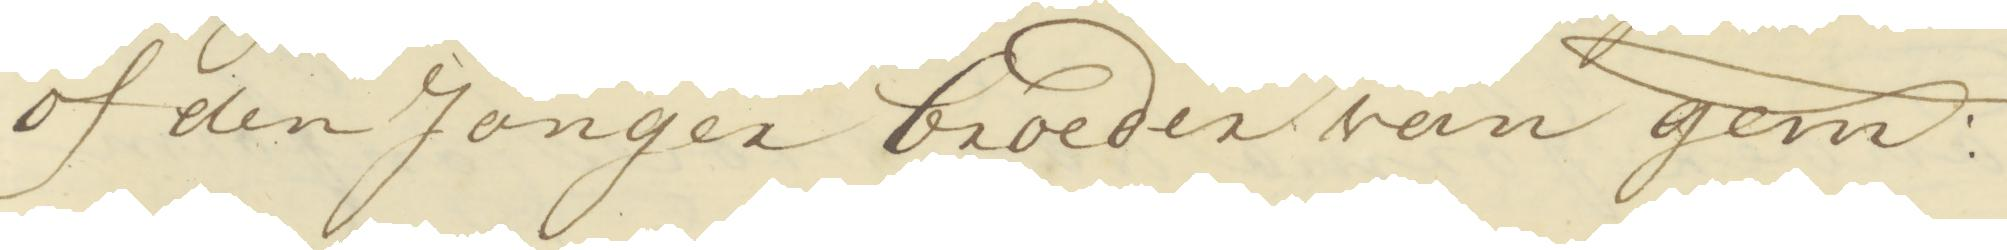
of den Jonger broeder van gem:
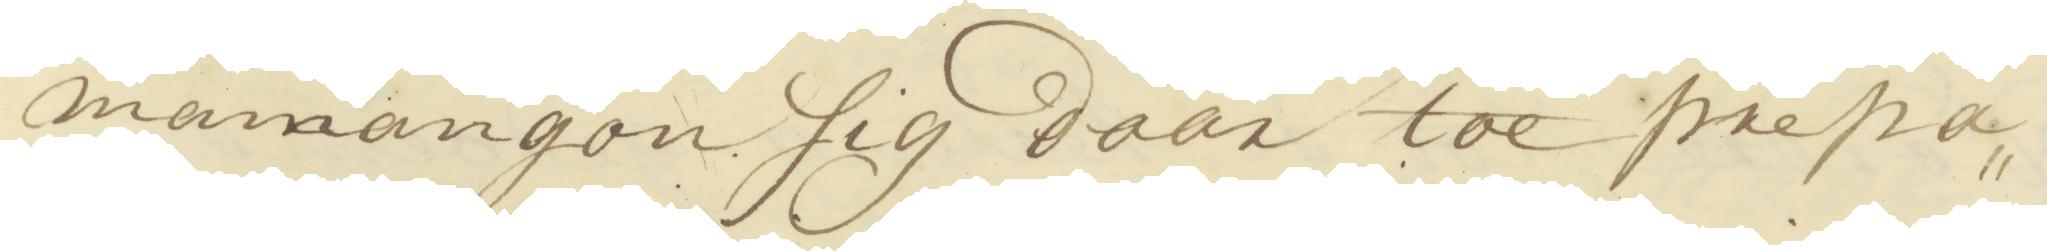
mamangon sig daar toe prepa„
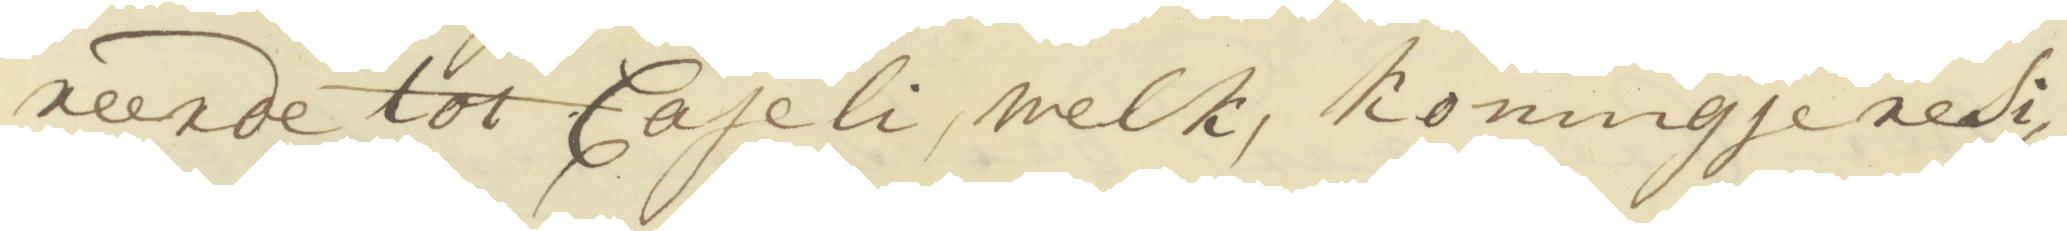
reerde tot Cajeli, welk, koningje resi„
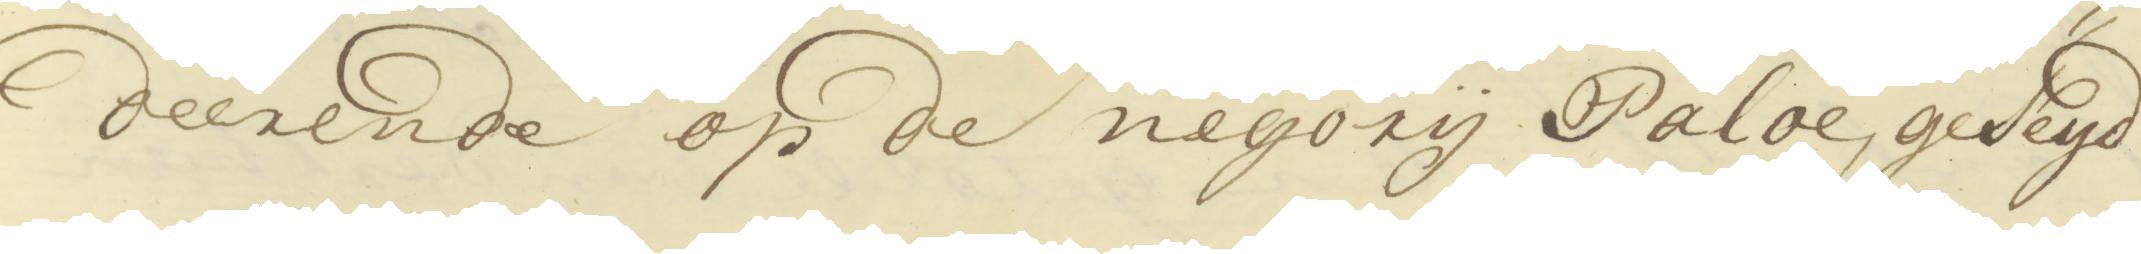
deerende op de negorij Paloe, geseyd
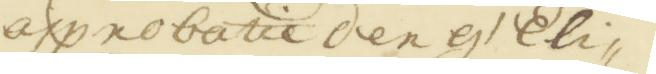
approbatie der g'Eli„
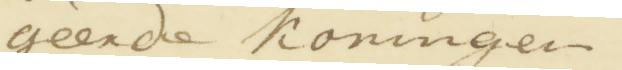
geerde koningen
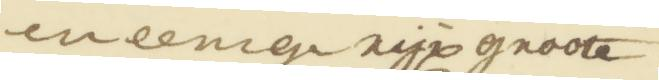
en eenige rijx groote
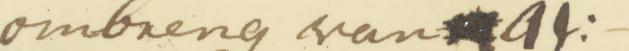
om breng van 41:
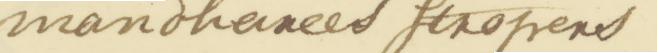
mandharees stropers
